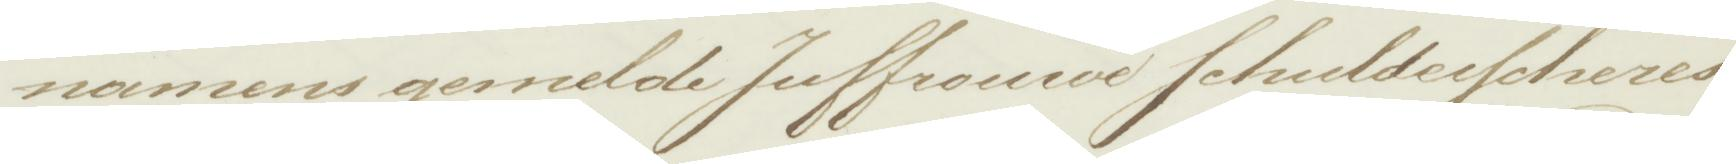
namens gemelde Juffrouwe schuldeischeres
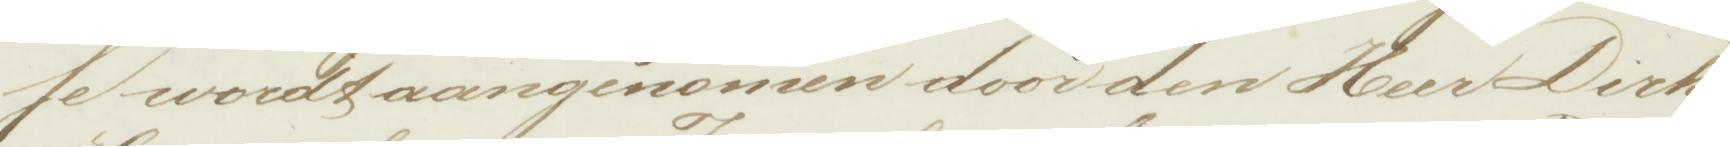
se wordt aangenomen door den Heer Dirk
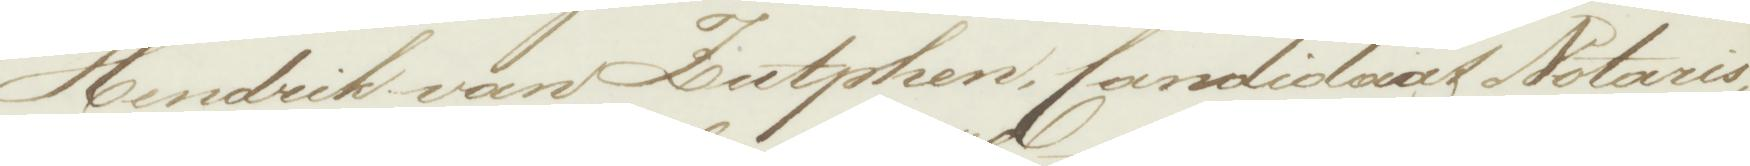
Hendrik van Zutphen, Candidaat Notaris,
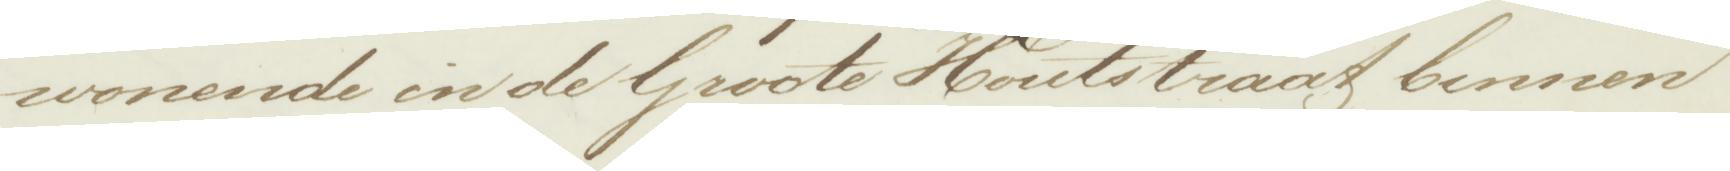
wonende in de Groote Houtstraat binnen
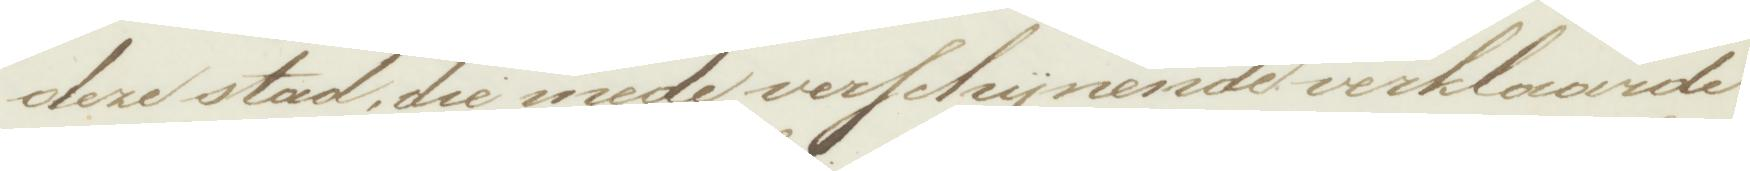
deze stad, die mede verschijnende verklaarde
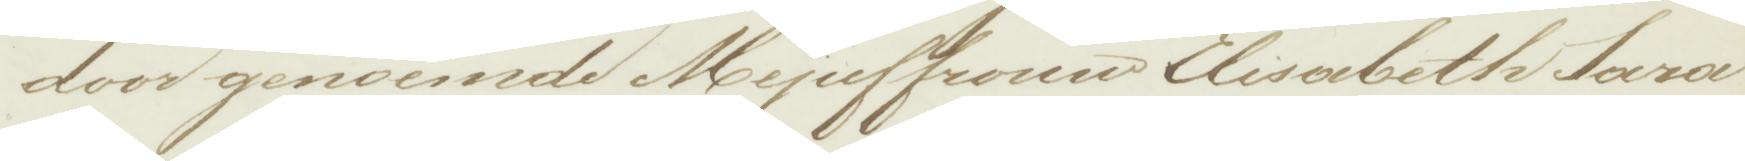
door genoemde Mejuffrouw Elisabeth Sara
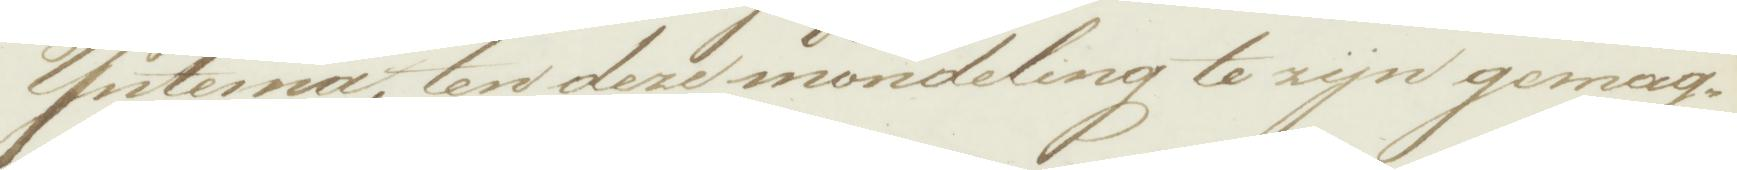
Yntema, ten deze mondeling te zijn gemag„
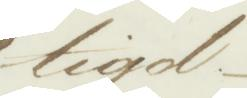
tigd.
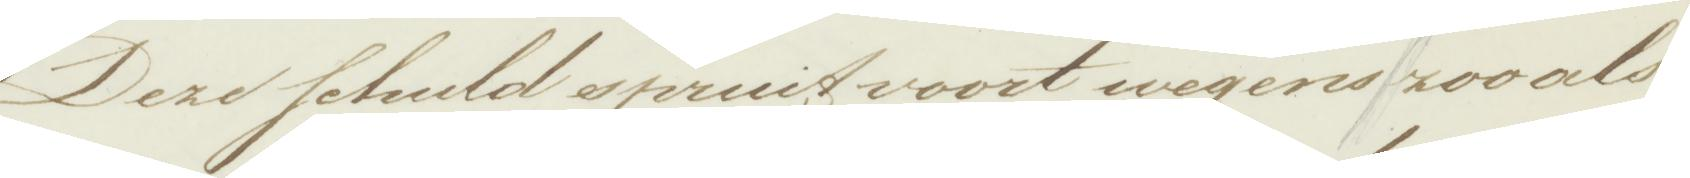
Deze schuld spruit voort wegens zoo als
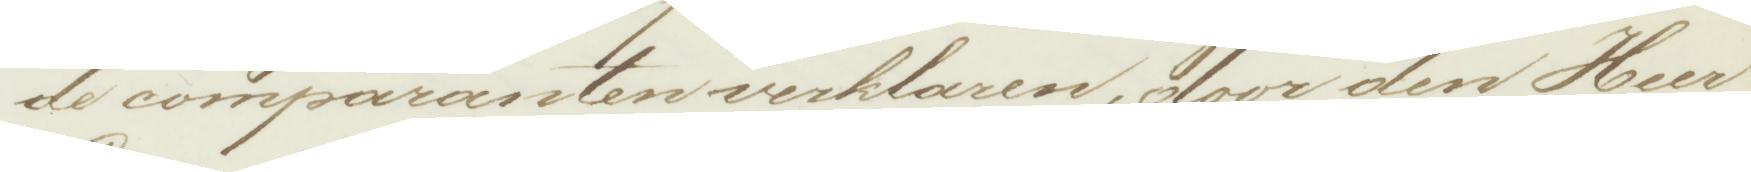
de comparanten verklaren, door den Heer
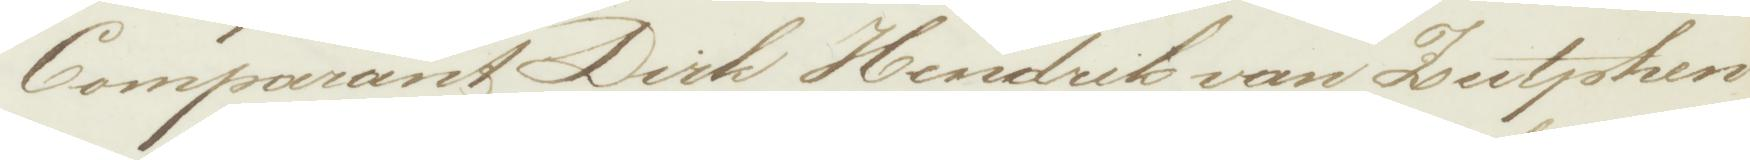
Comparant Dirk Hendrik van Zutphen
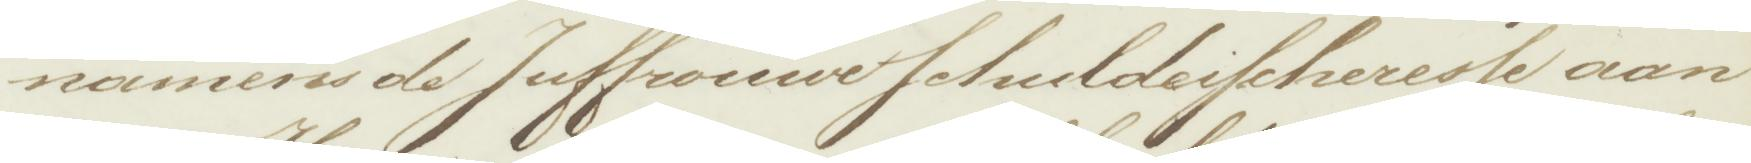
namens de Juffrouwe schuldeischeresse aan
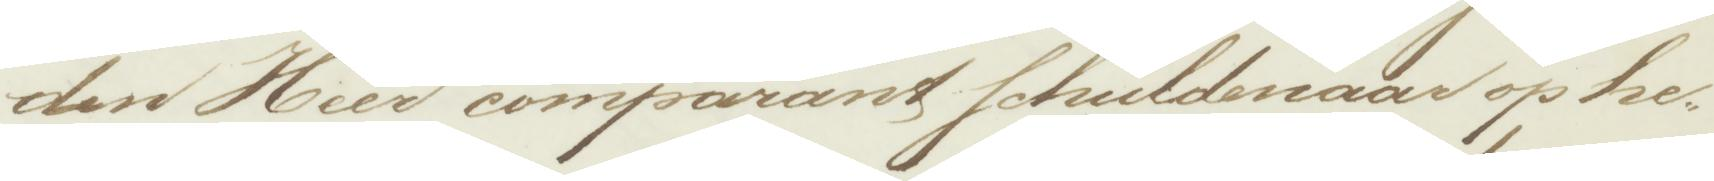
den Heer comparant schuldenaar op he„
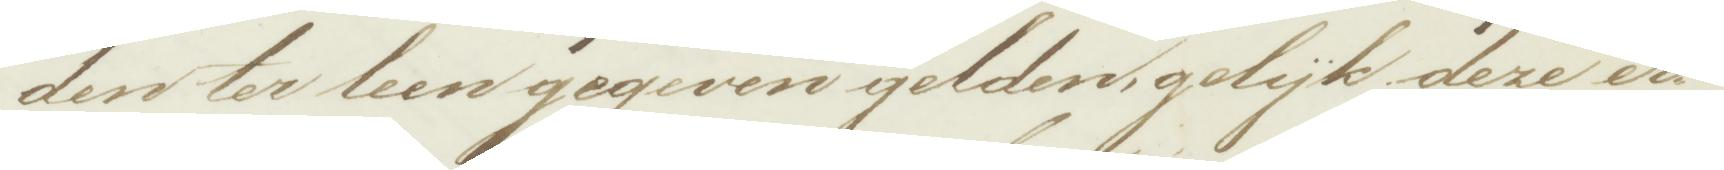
den ter leen gegeven gelden, gelijk deze er
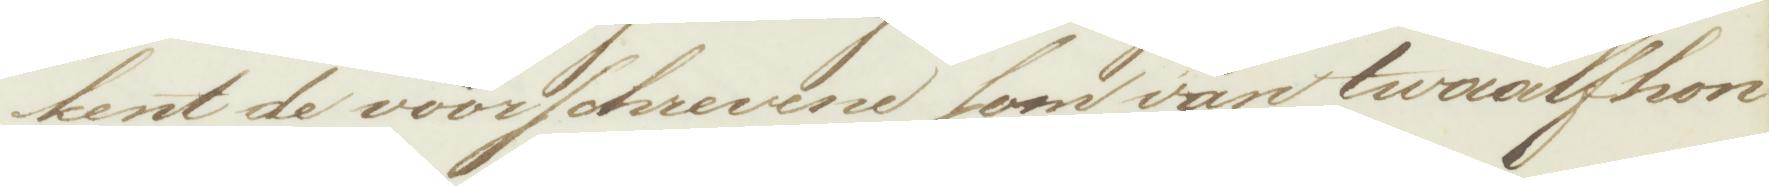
kent de voorschrevene som van twaalf hon
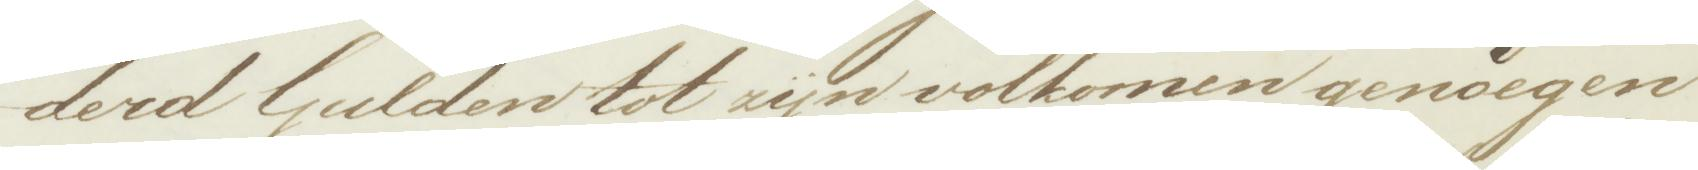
derd Gulden tot zijn volkomen genoegen
